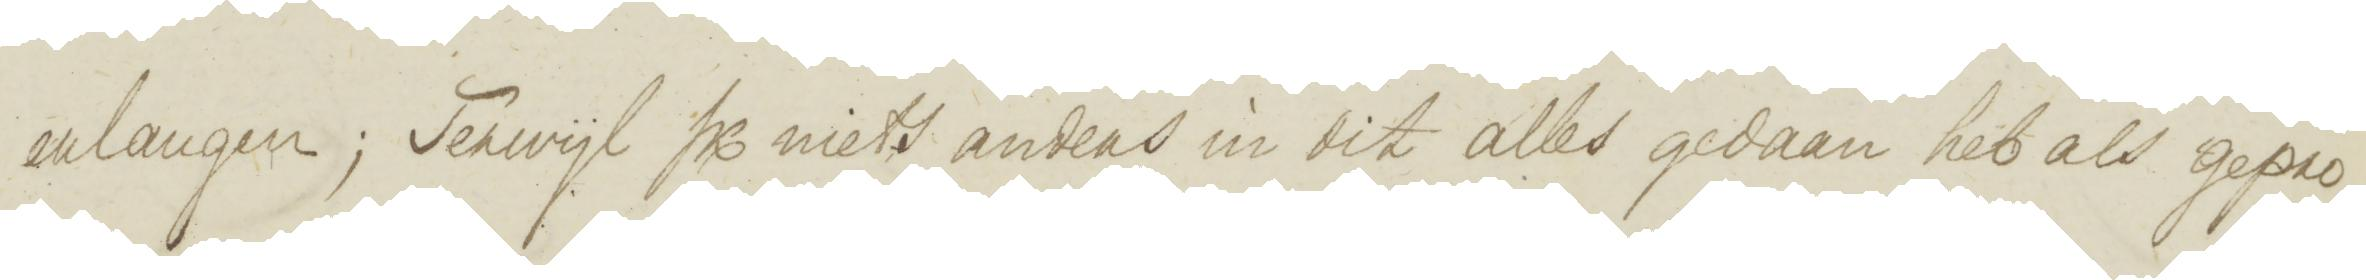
erlangen; Terwijl Ik niets anders in dit alles gedaan heb als gepro
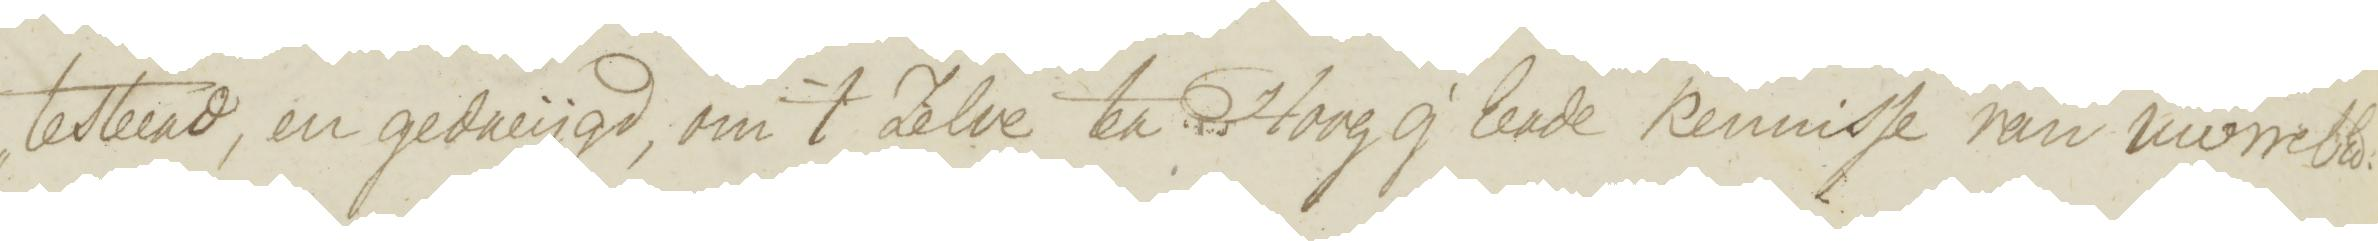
testeerd, en gedreijgd, om ’t zelve ter Hoog g’Eerde kennisse van uw wel Ed:
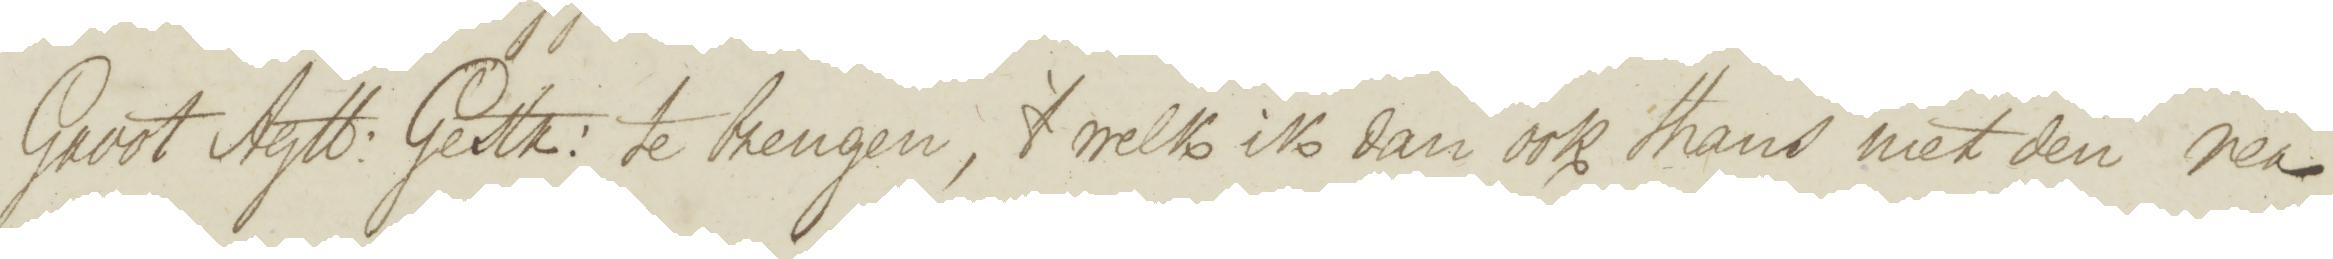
Groot Agtb: Gestr: te brengen, ’t welk ik dan ook thans niet den ver
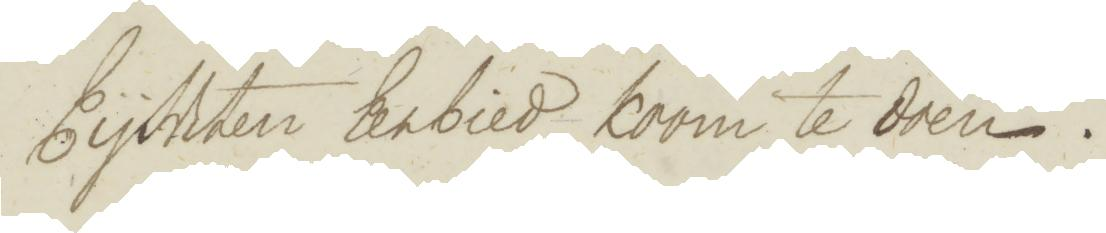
Eijschten Eerbied koom te doen.
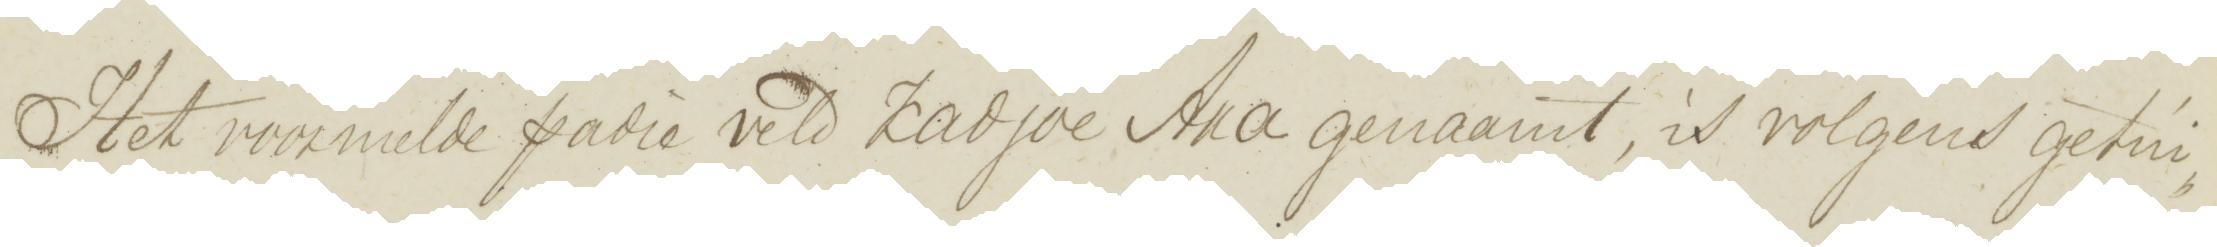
Het voormelde padie veld kadjoe Ara genaamt, is volgens getui„
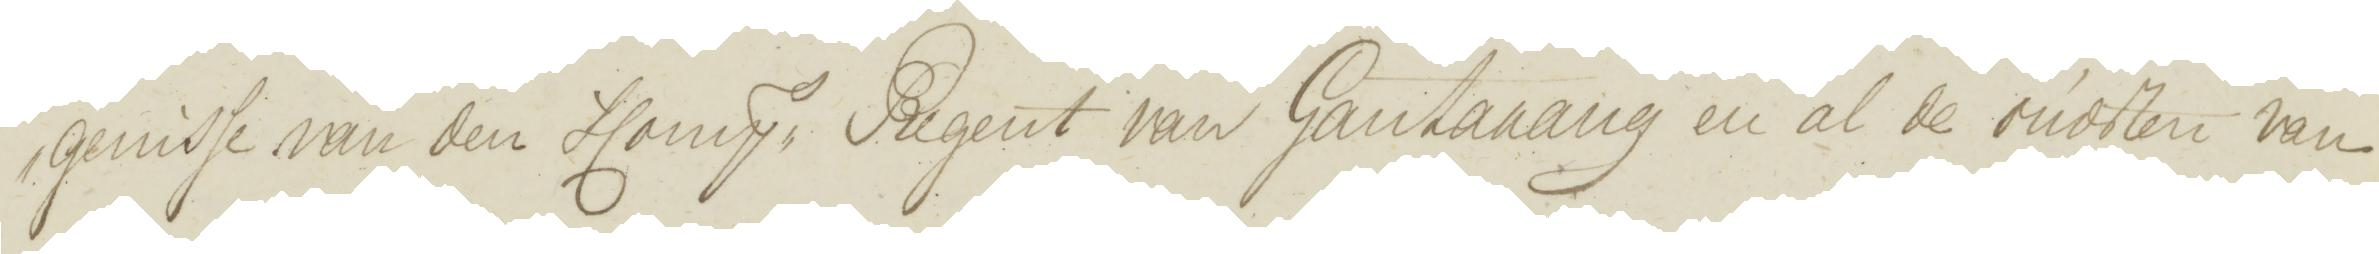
„genisse van den sComp„s Regent van Gantarang en al de oudsten van
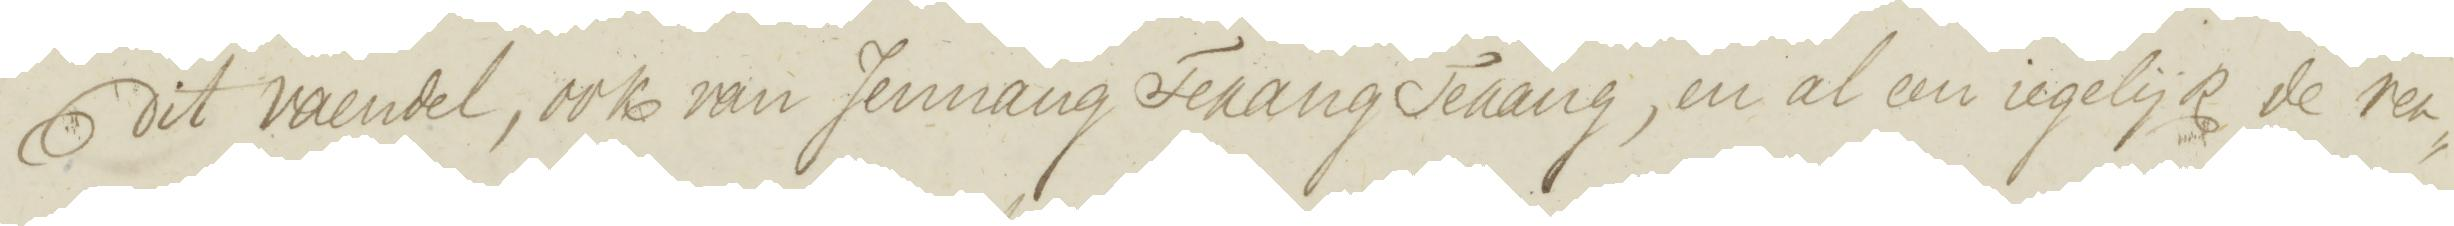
dit vaendel, ook van Jennang Terang Terang, en al een iegelijk de ver
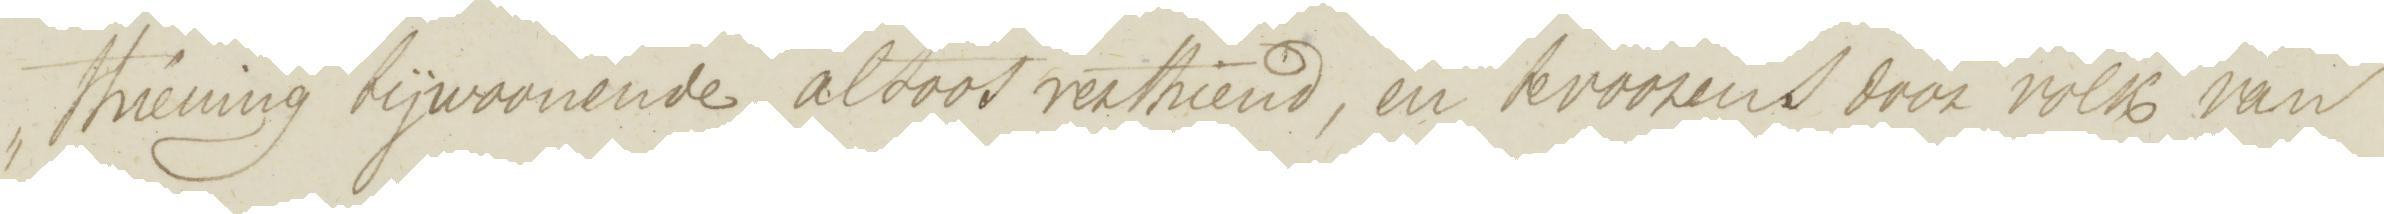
„thiening bijwoonende, altoos verthiend, en tevoorens door volk van
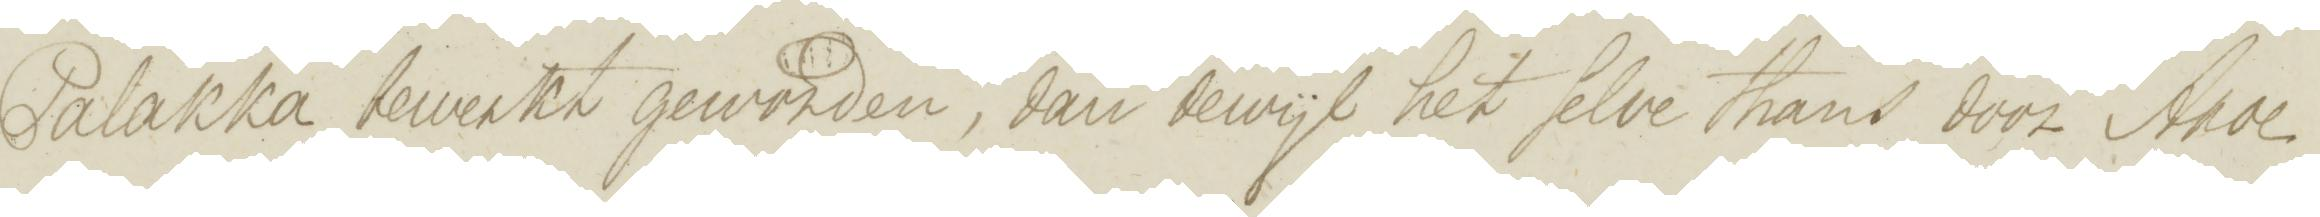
Palakka bewerkt geworden, dan dewijl het selve thans door Aroe
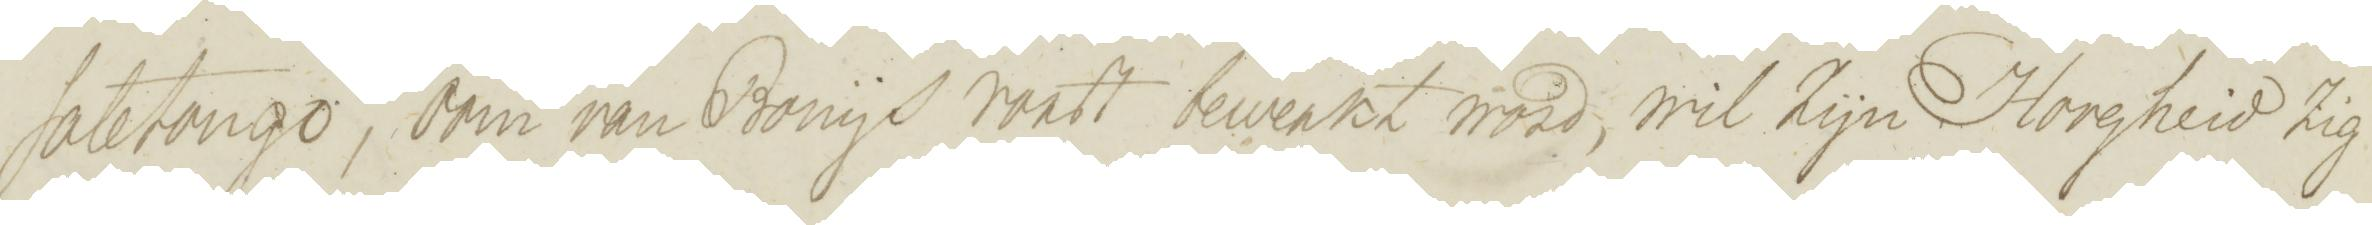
saletongo, oom van Bonijs vorst bewerkt word, wil zijn Hoogheid zig
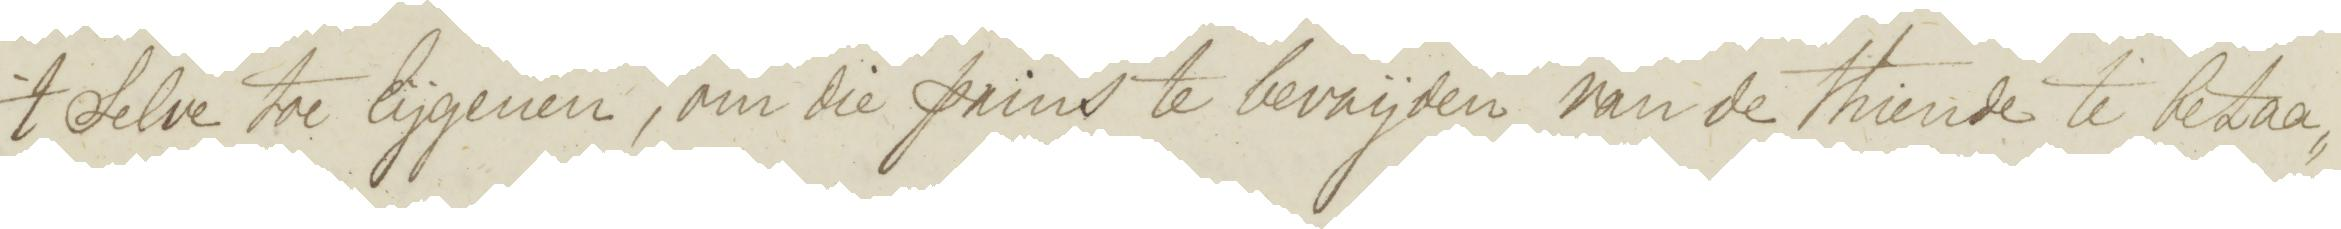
’t selve toe Eijgenen, om die prins te bevrijden van de thiende te betaa„
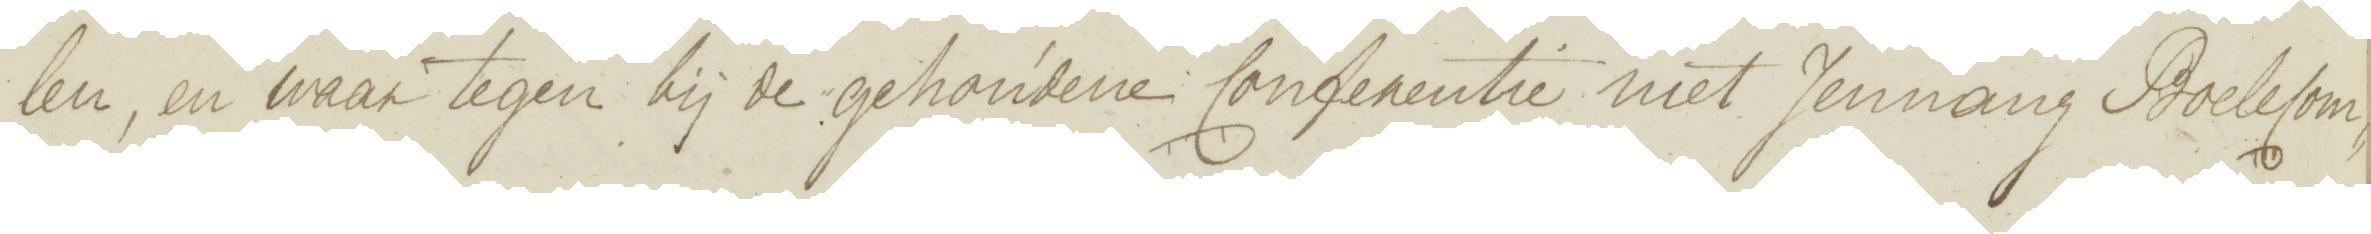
len, en waar tegen bij de gehoudene conferentie niet Jennang Boelecom
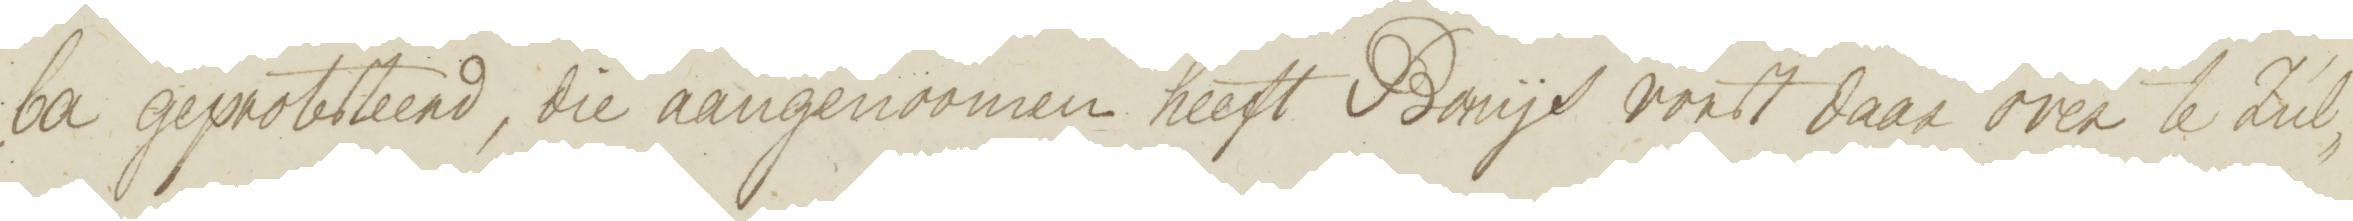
ba geprotesteerd, die aangenoomen heeft Bonijs vorst daar over te zul„
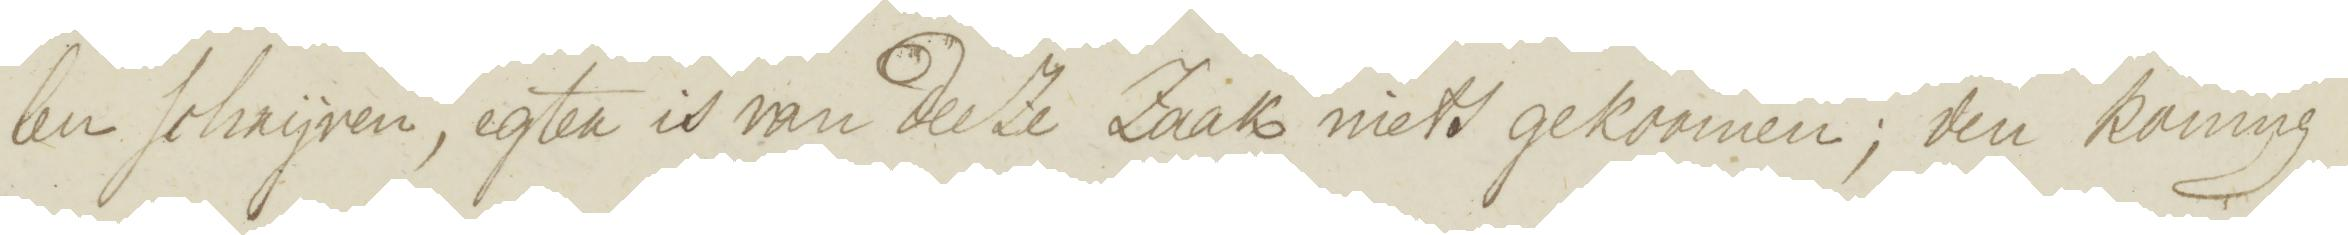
len schrijven, egter is van deeze zaak niets gekoomen; den koning
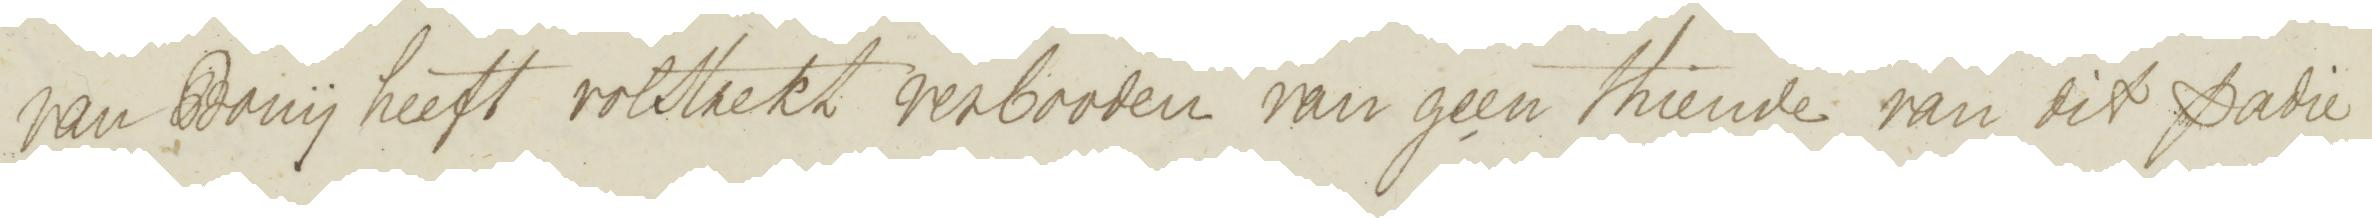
van Bonij heeft volstrekt verbooden van geen thiende van dit padie
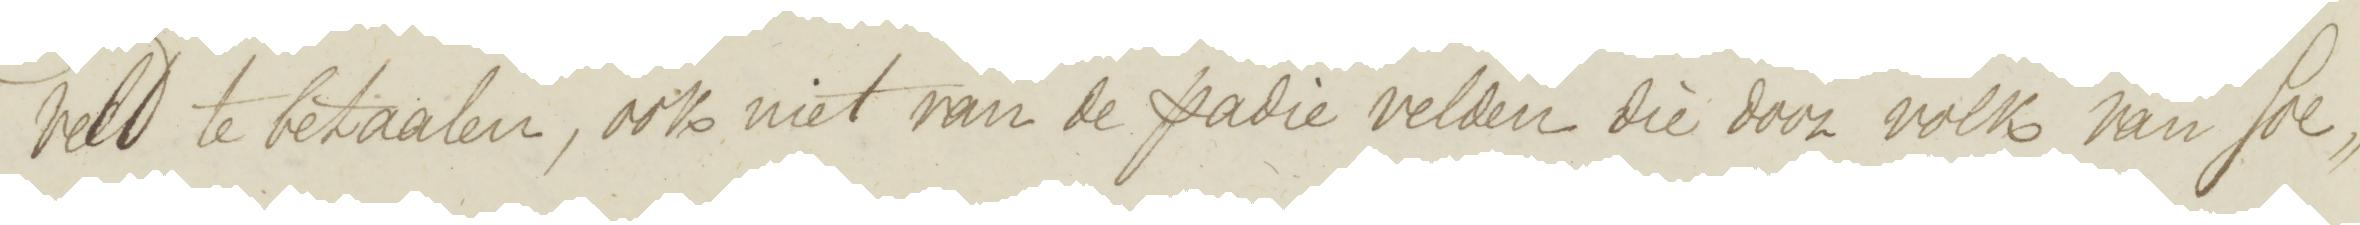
veld te betaalen, ook niet van de padie velden die door volk van soe
